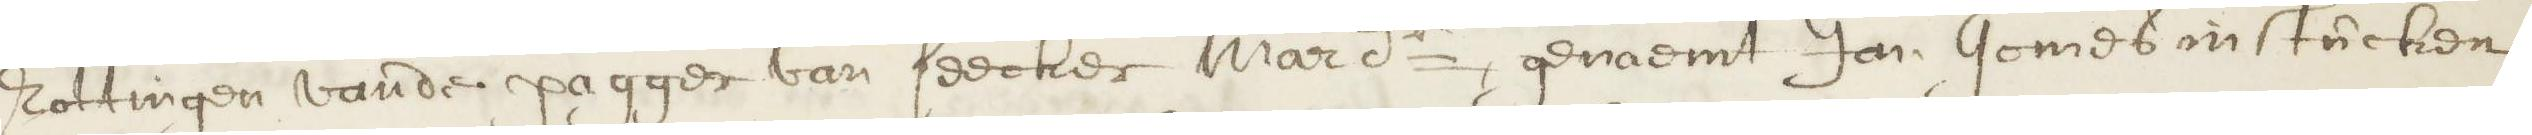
Rottingen vande pagger van seecker Mard=r, genaemt Jan Gomes in stucken
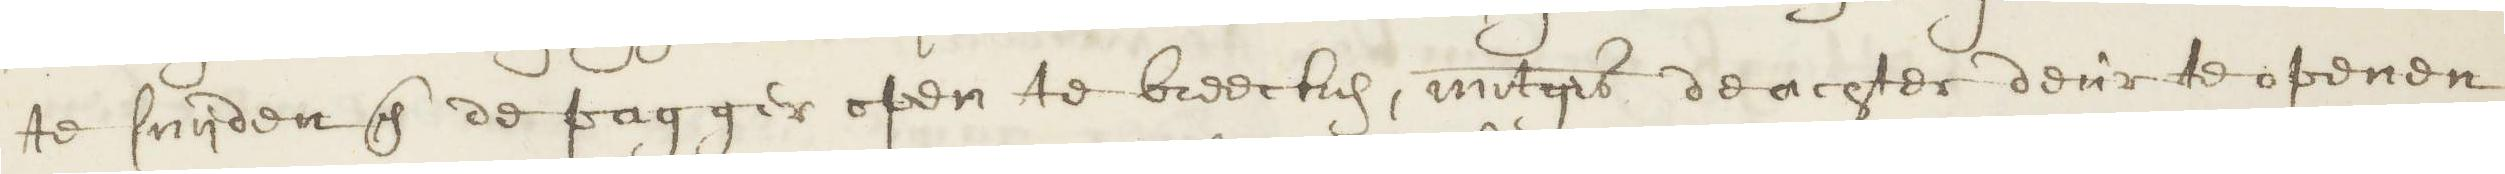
te snijden ende de pagger open te breecken, mitgrs de achter deur te openen
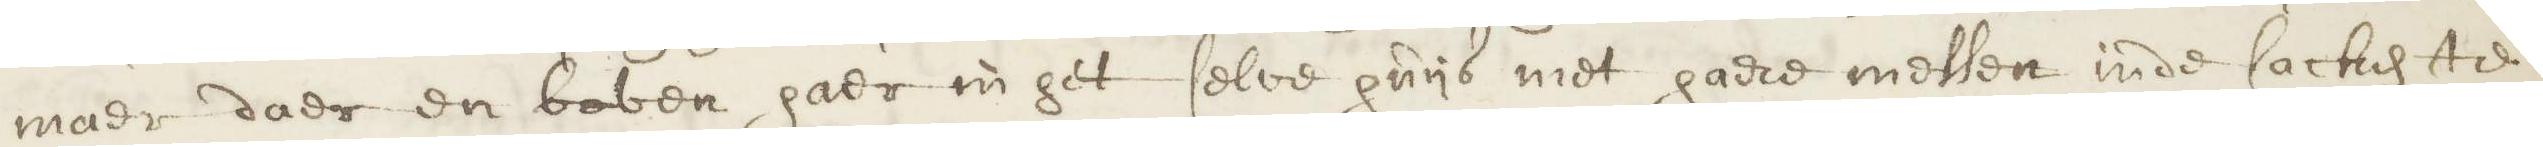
maer daer en bover haer in het selve huijs met haere messen inde sacken te
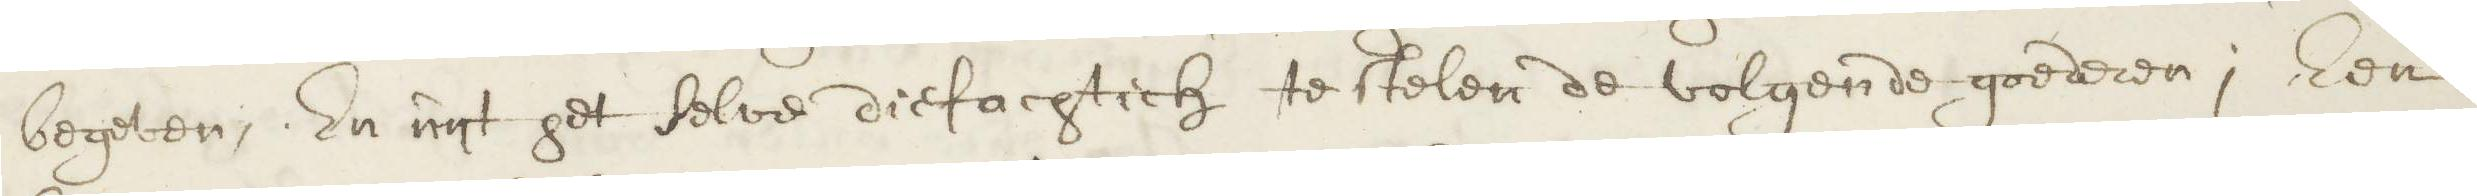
begeven; En uyt het selve diefachtich te stelen de volgende goederen; hen
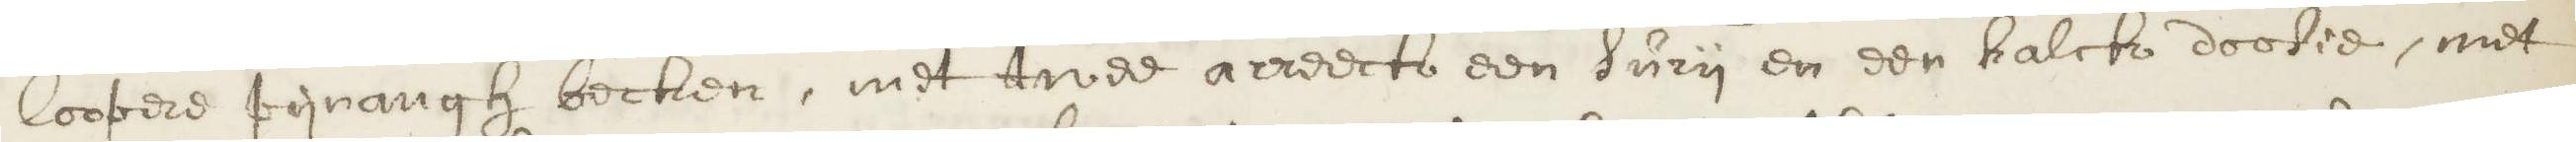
loopere pijnangh becken, met twee arreeck een surij en den kalck doosie, met
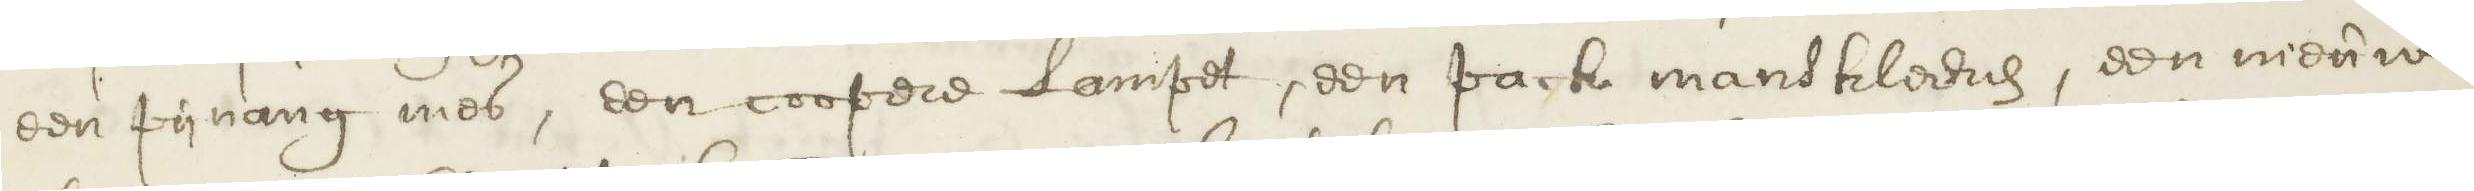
den pijnang mes, den coopere Lampet, een pack manskleeren, een nieuw
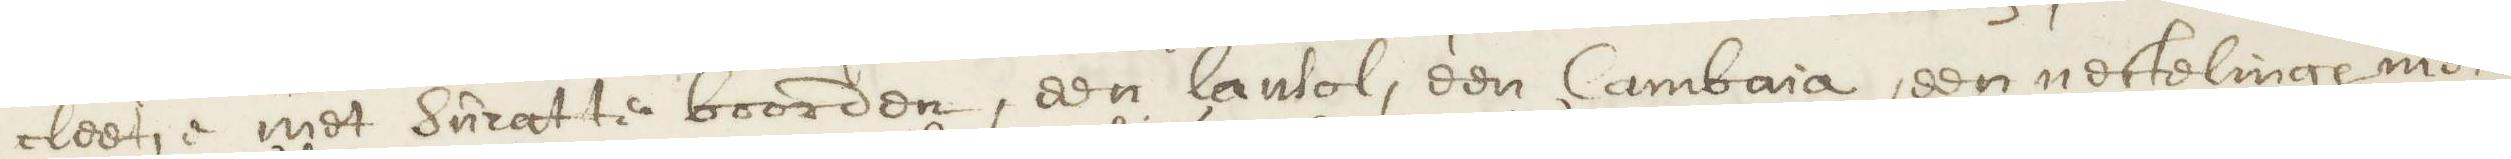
cleetje met surat te boorden, een lansol, den Cambaia, een nestelingh met
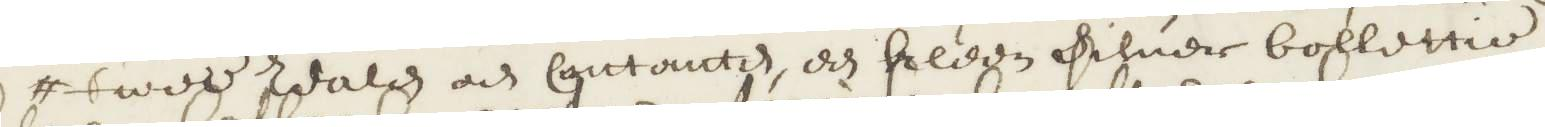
„ twee realen aen contanten, een kleen silver bollettie
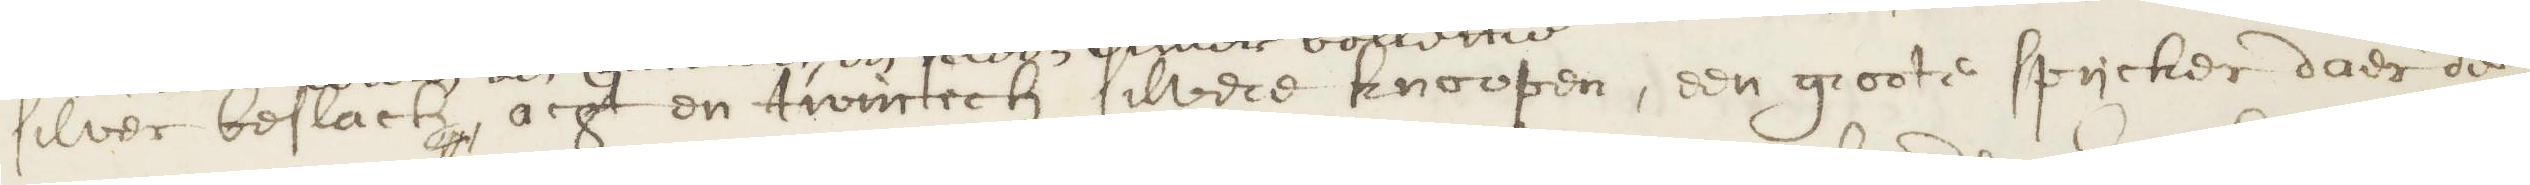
silver beslach, acht en twintich silvere knoopen, een groote spijcker daer de
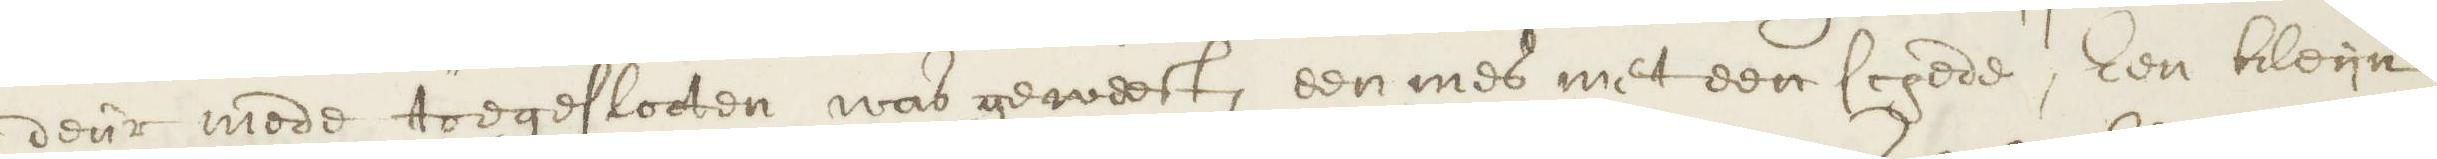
deur mede toegeslooten was geweest, een mes met een schede; Een kleijn
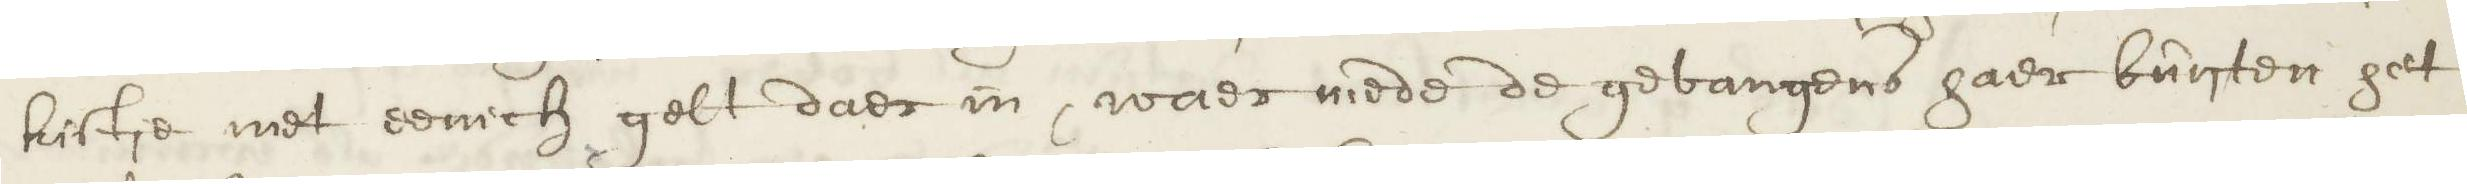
kistje met eenich gelt daer in, waer mede de gevangens haer buyten het
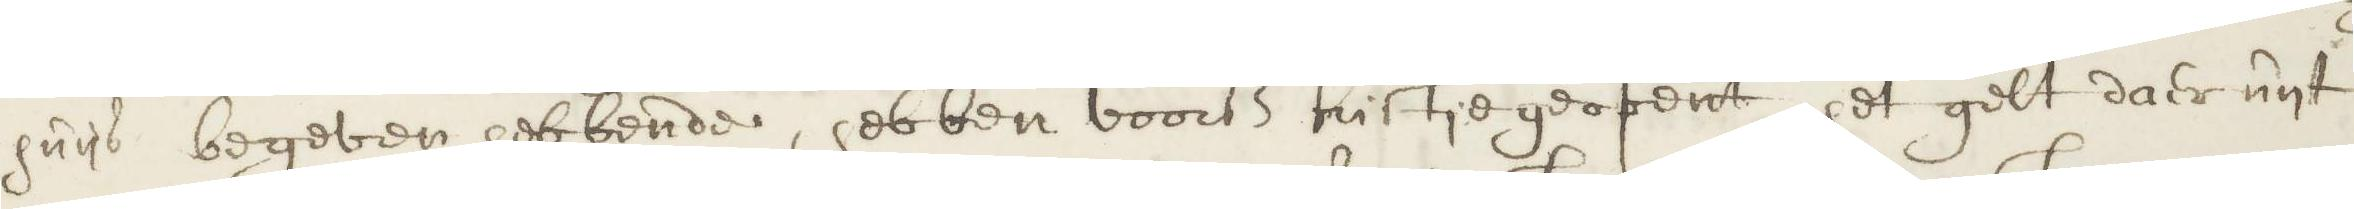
huijs begeven hebbende, hebben voors kistje geopent, het gelt daer uyt
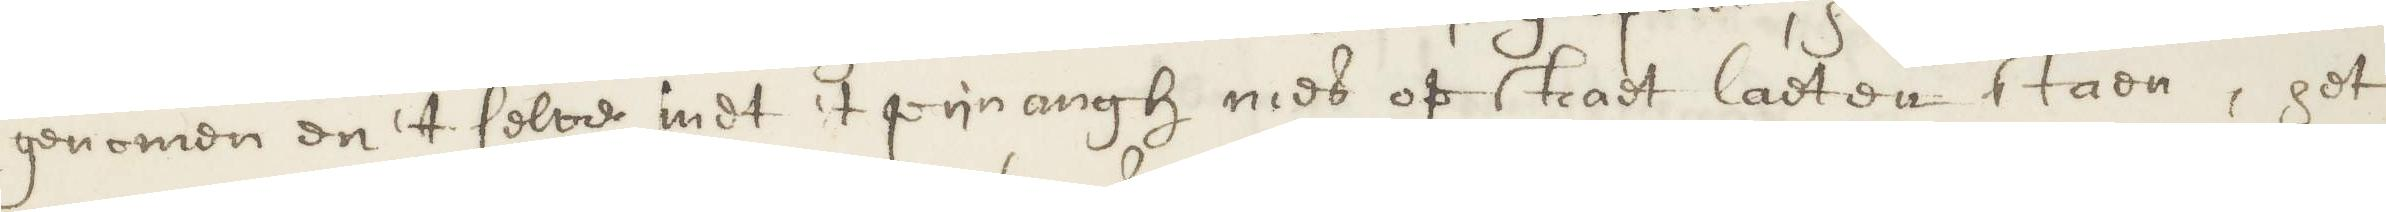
genomen en ’t selve met ’t pijnangh mes op straet laeten staen, het
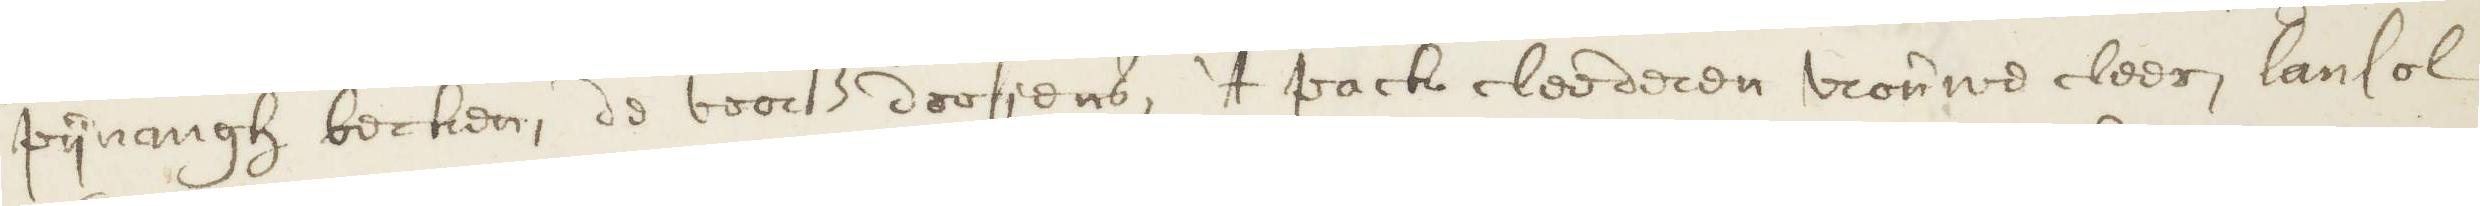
pijnangh becken, de voorsz doosjens, ’t pack cleederen vrouwe cleer, lansol
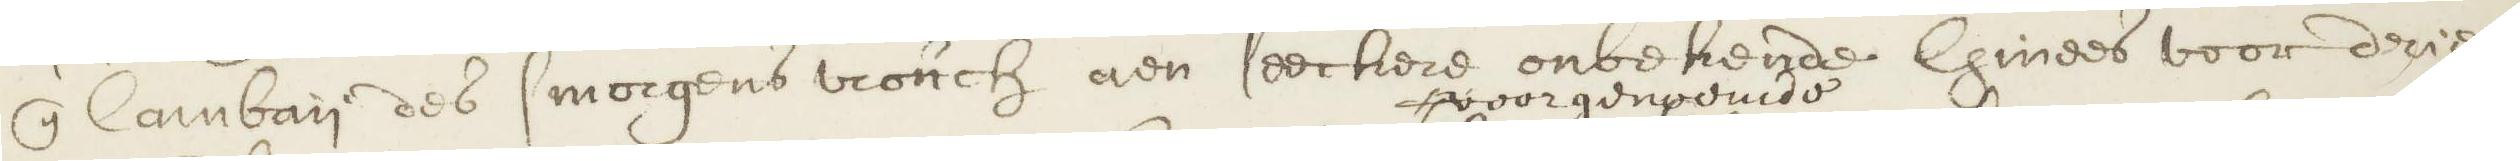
ende Cambaij des smorgens vrouch aen seeckere onbekende Coinees voor drie
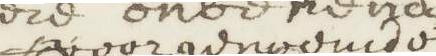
#voorgenoemde
